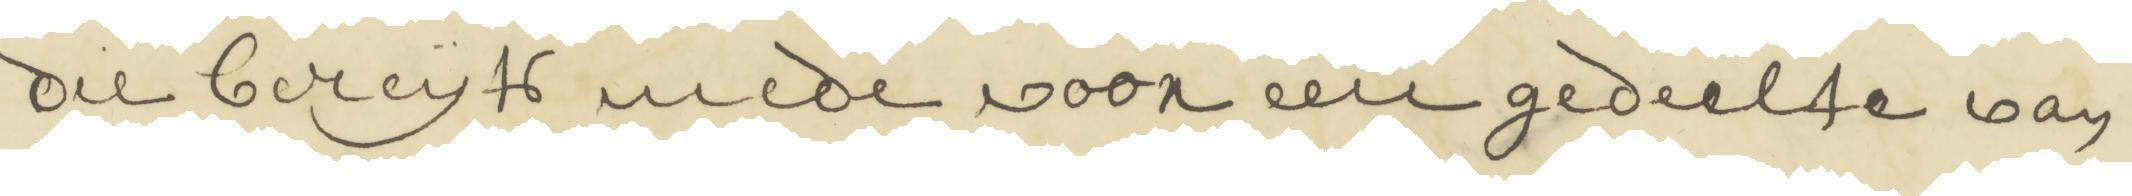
die bereijts mede voor een gedeelte van
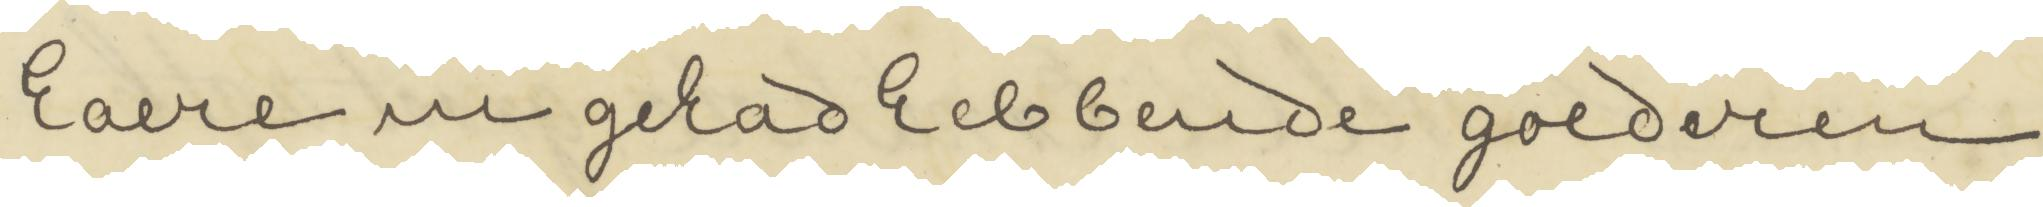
haere in gehad hebbende goederen
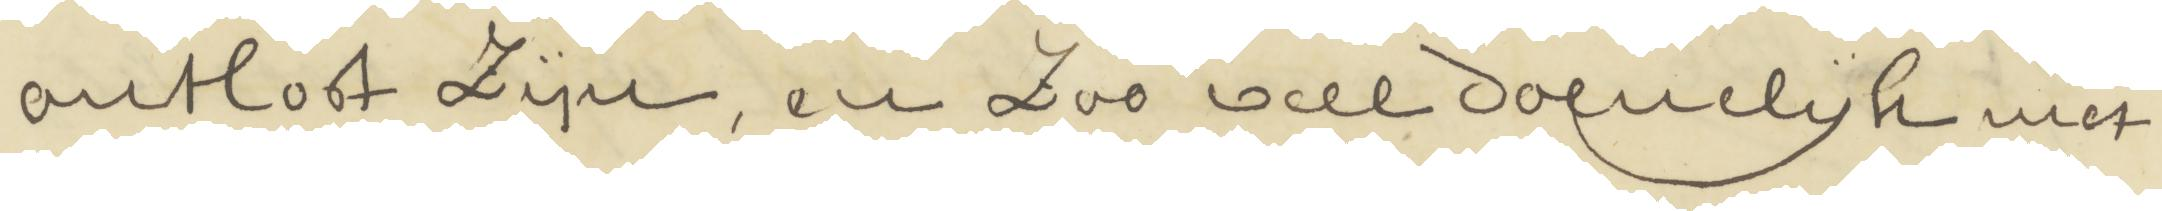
ontlost zijn, en zoo veel doenelijk met
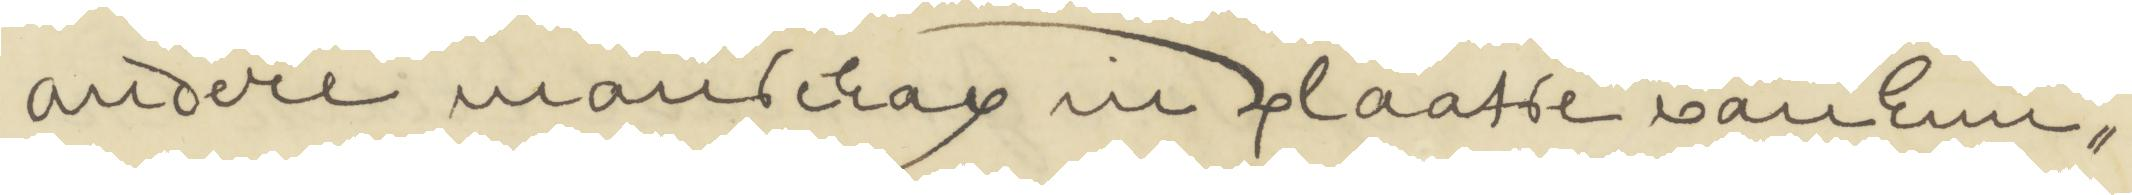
andere manschap in plaatse van hun„
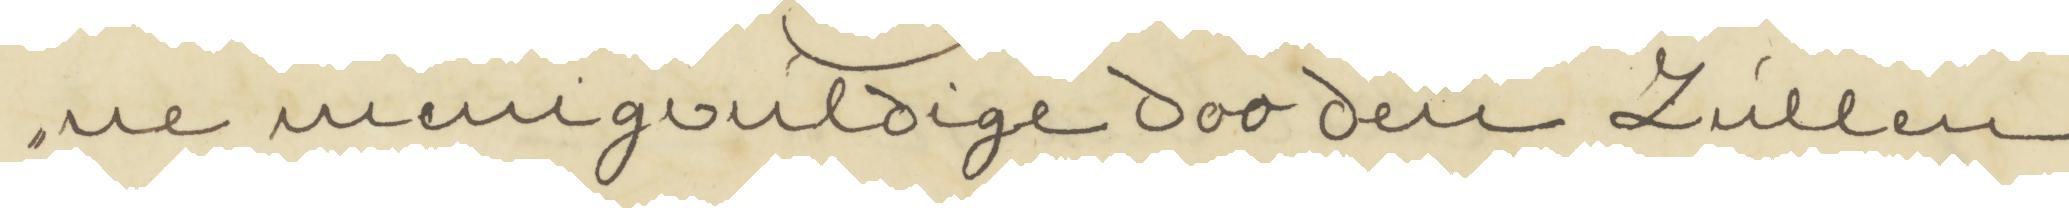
„ne menigvuldige dooden zullen
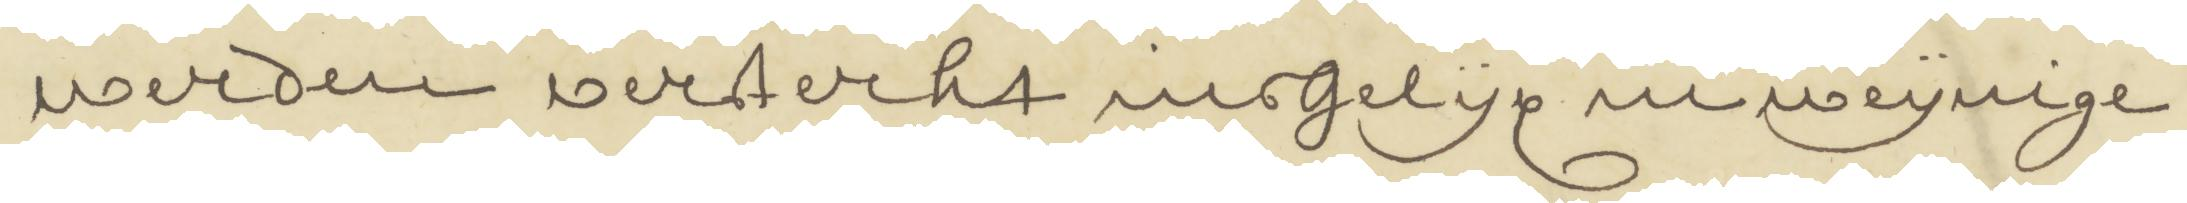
werden versterkt insgelijx in weijnige
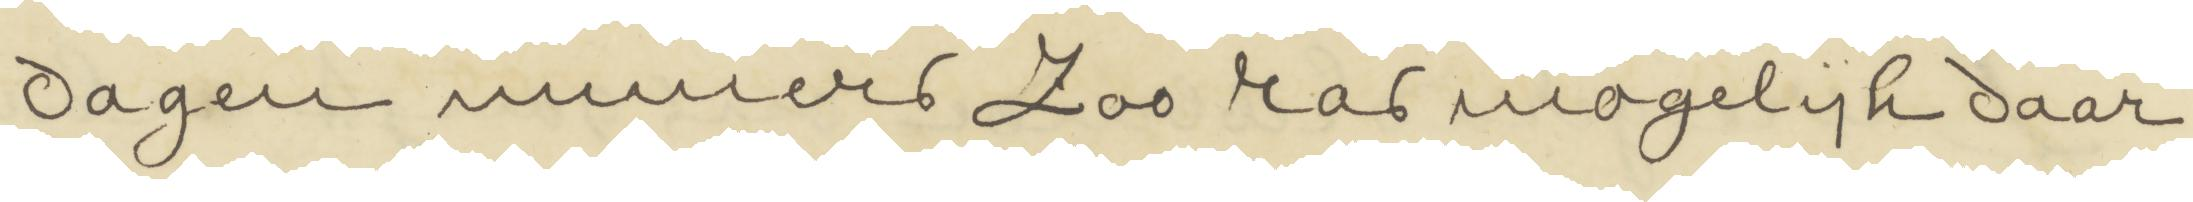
dagen immers zoo ras mogelijk daar
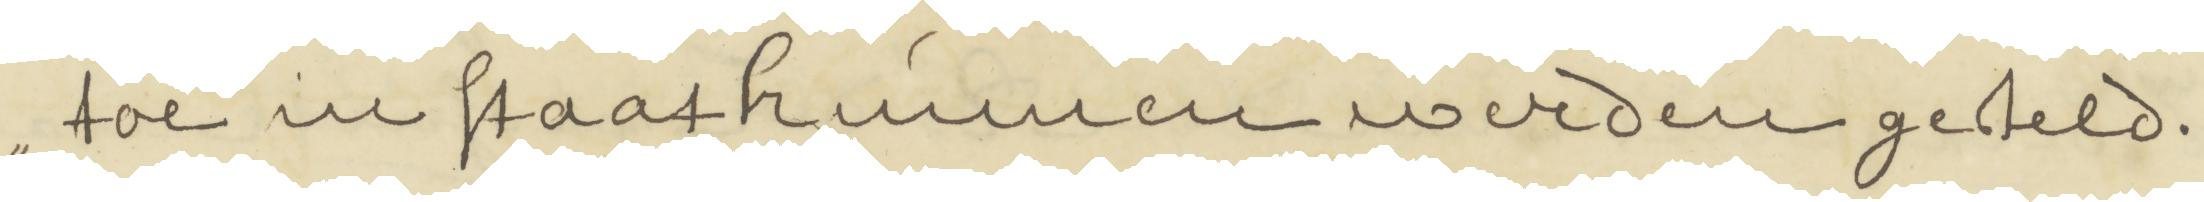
„toe in staat kunnen werden gesteld.
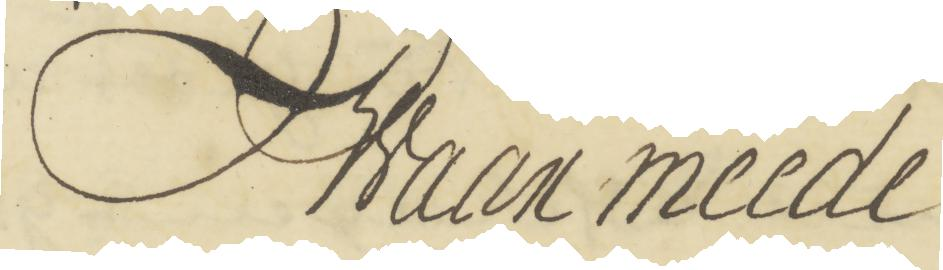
Waar meede
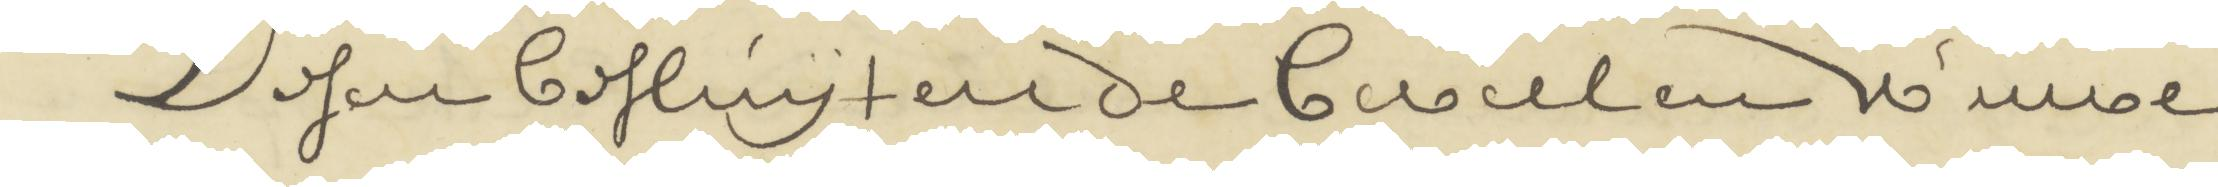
Desen besluijtende beveelen w'uwe
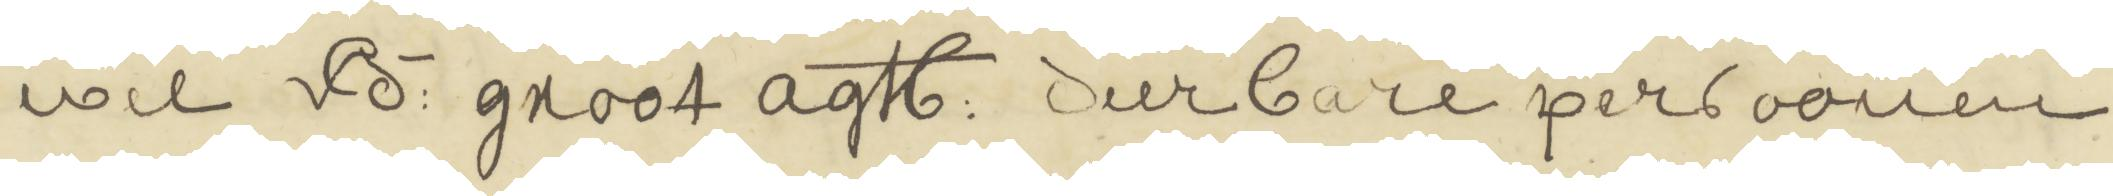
wel Ed: groot agtb: dierbare persoonen
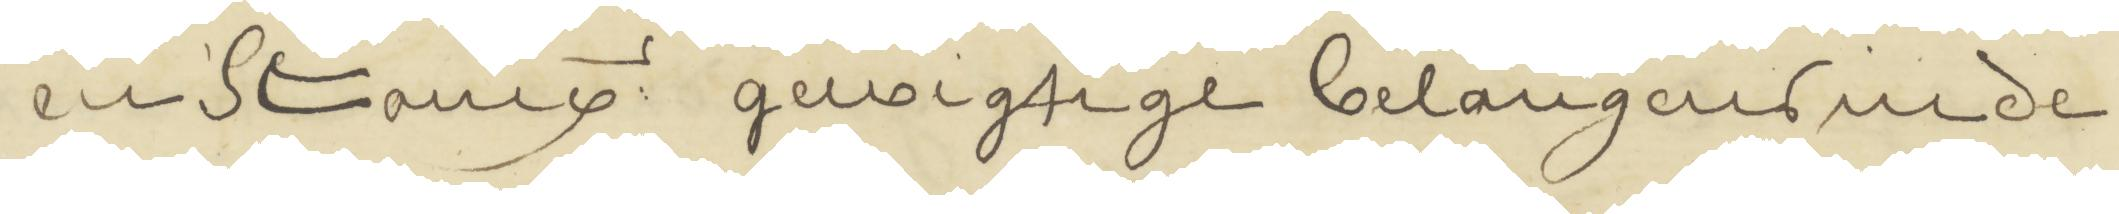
en ’s Comp:s gewigtige belangens in de
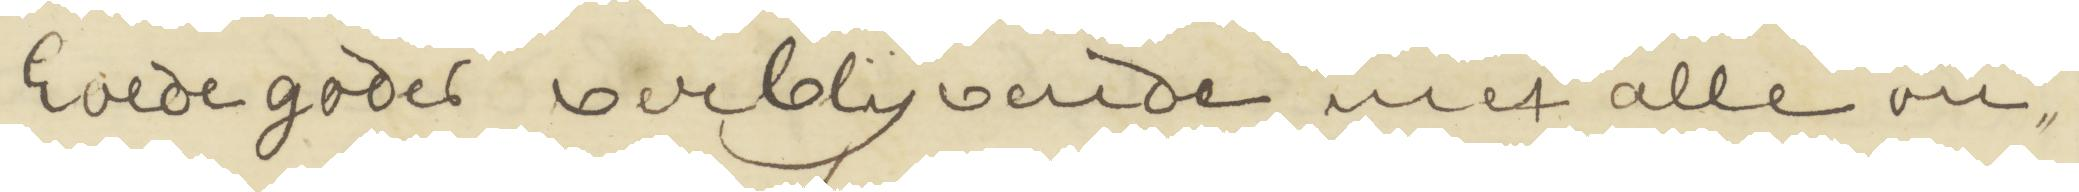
hoede godes verblijvende met alle on„
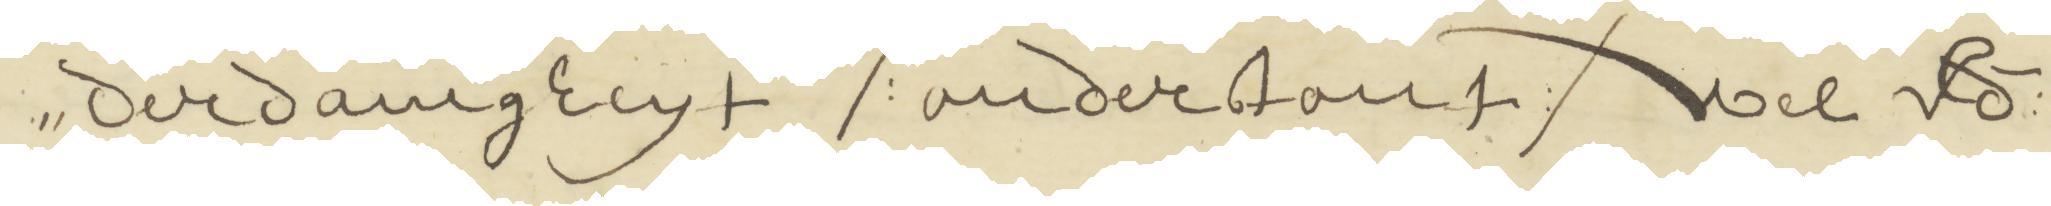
„derdanigheijt /:onderstont:/ wel Ed
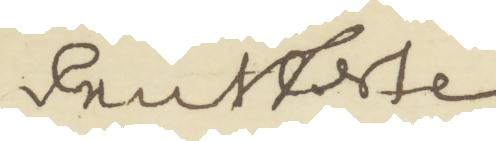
Erntfeste
